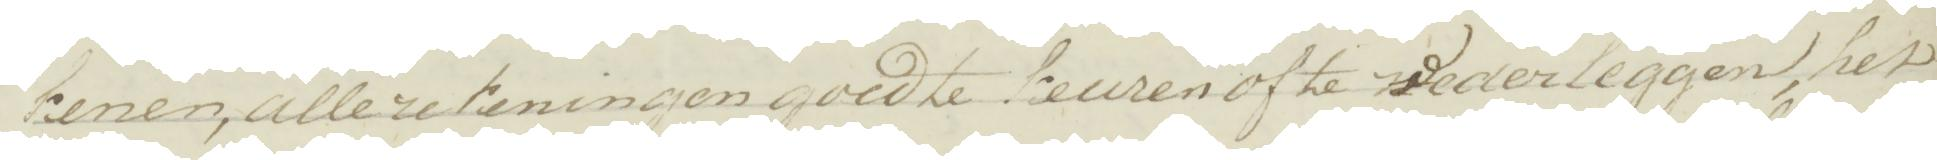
kenen, alle rekeningen goed te keuren of te wederleggen, het
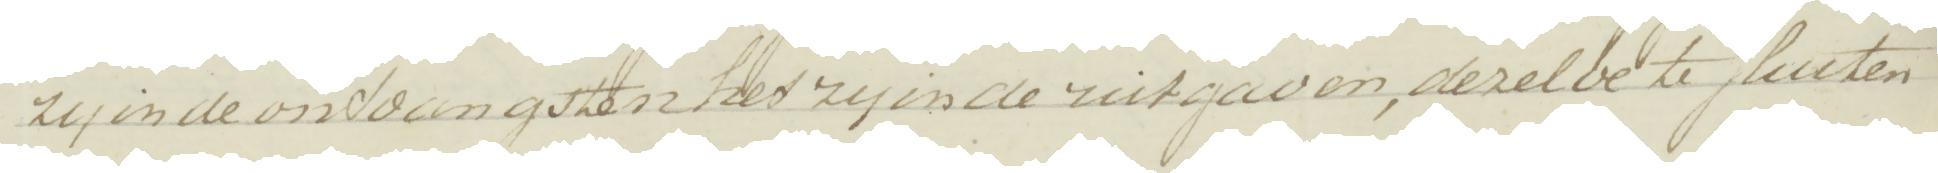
zy in de ontvangsten het zy in de uitgaven, dezelve te sluiten
